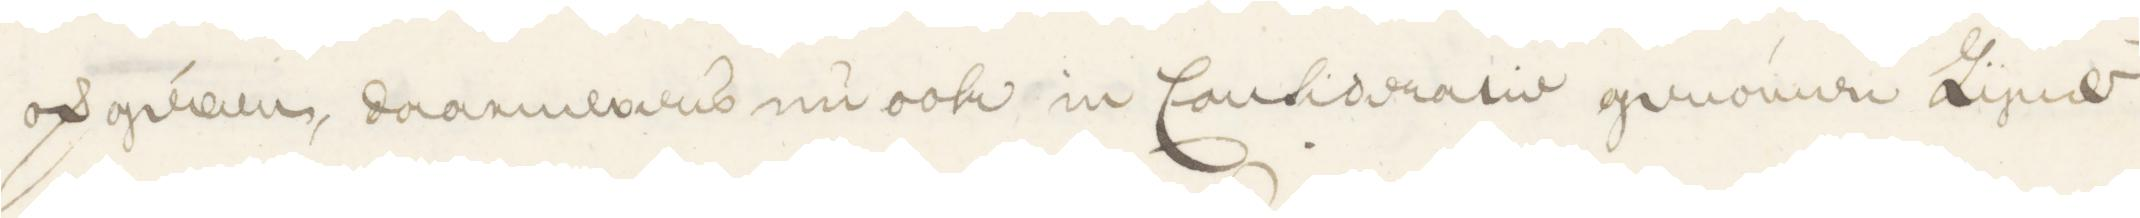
overgeven, daarneevens nu ook in consideratie genomen zijnde
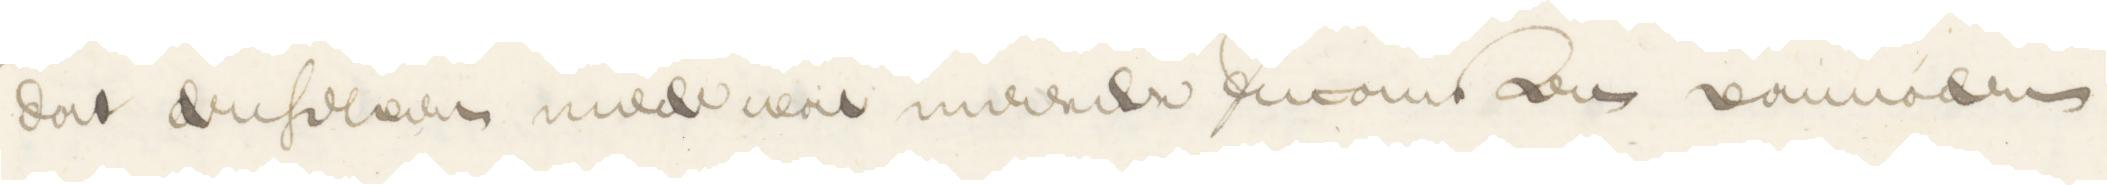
dat denselven mede wat meerder Incomsten vannoden
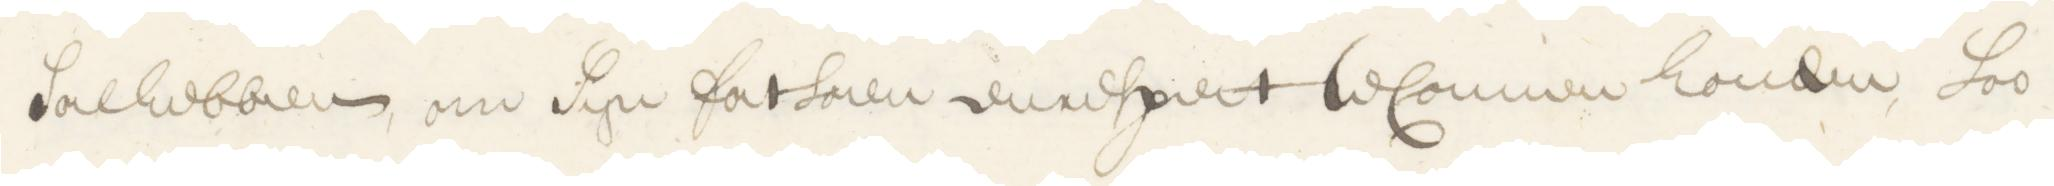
sal hebben, om sijn fatsoen en respect teconnen houden, soo
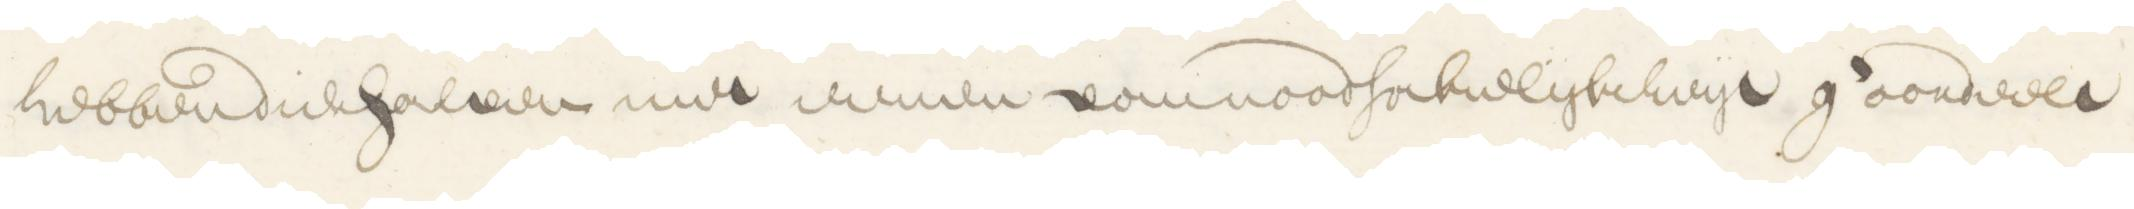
hebben dierhalven met eenen van noodsakelijkheijt g’oordeelt
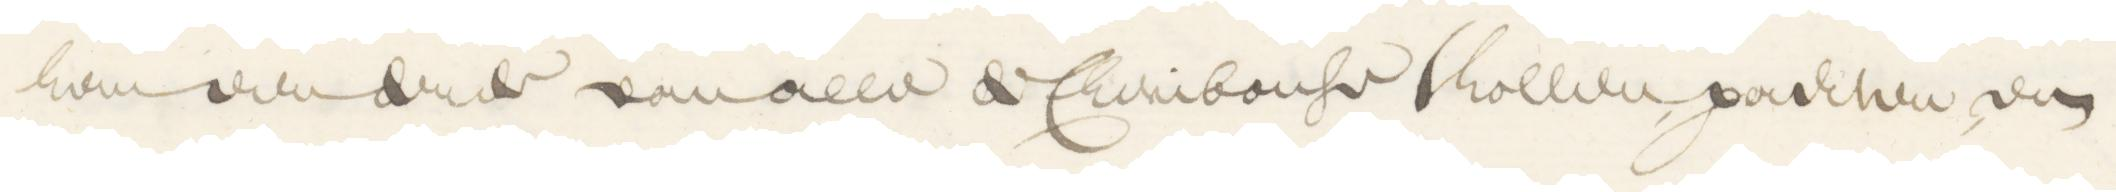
hem een derde van alle de Cheribonse tollen, pachten, en
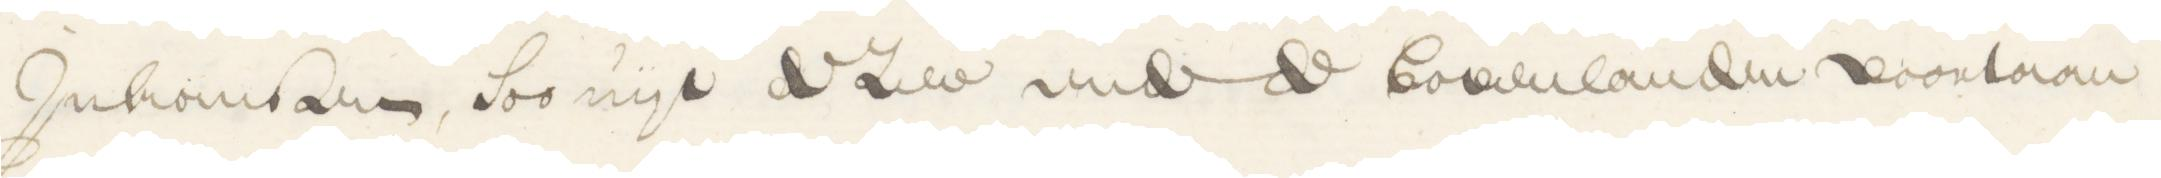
Jnkomsten, soo uijt de zee ende de bovenlanden voortaan
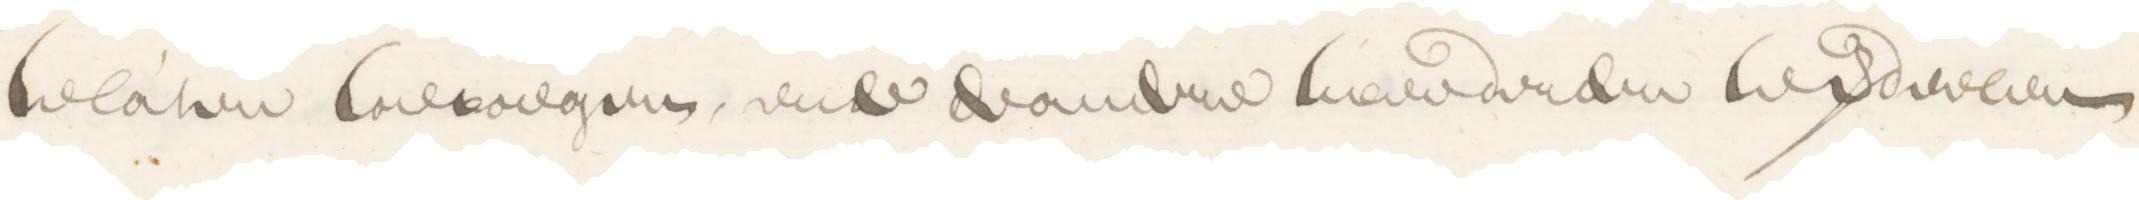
telaten toevoegen, ende de andere tweederden te verdeelen
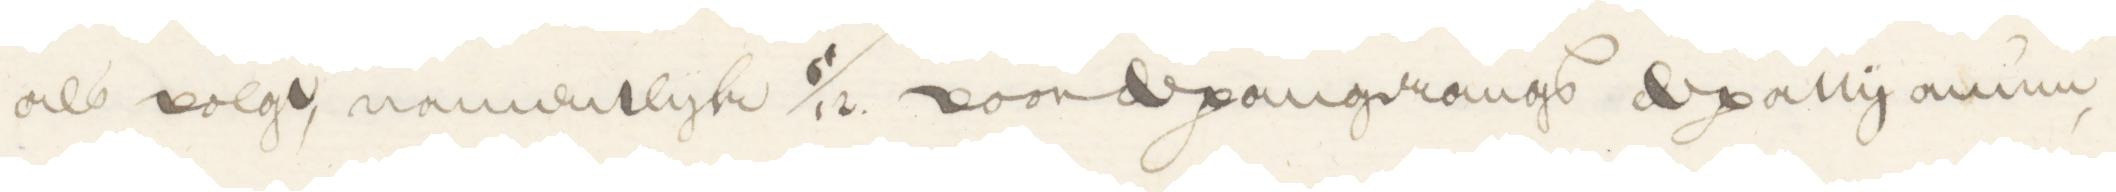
als volgt, namentlijk 6t/12. voor de pangerangs de pattij anum,
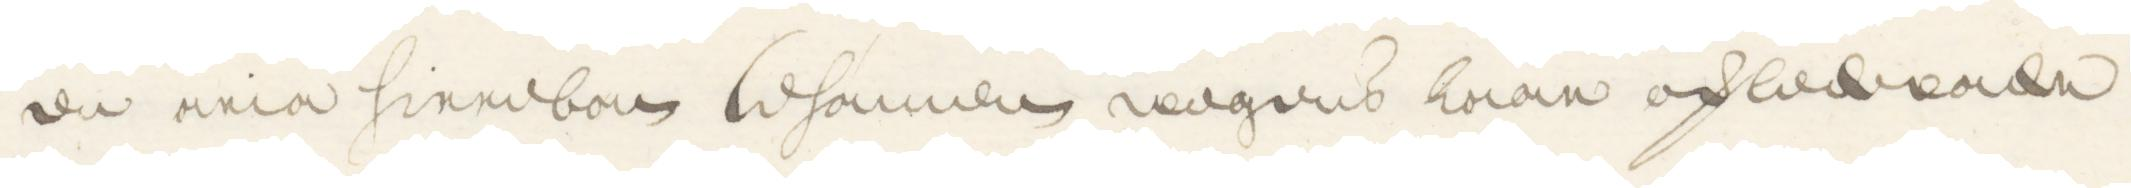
en aria sirrebon tesamen wegens haar overlede vader
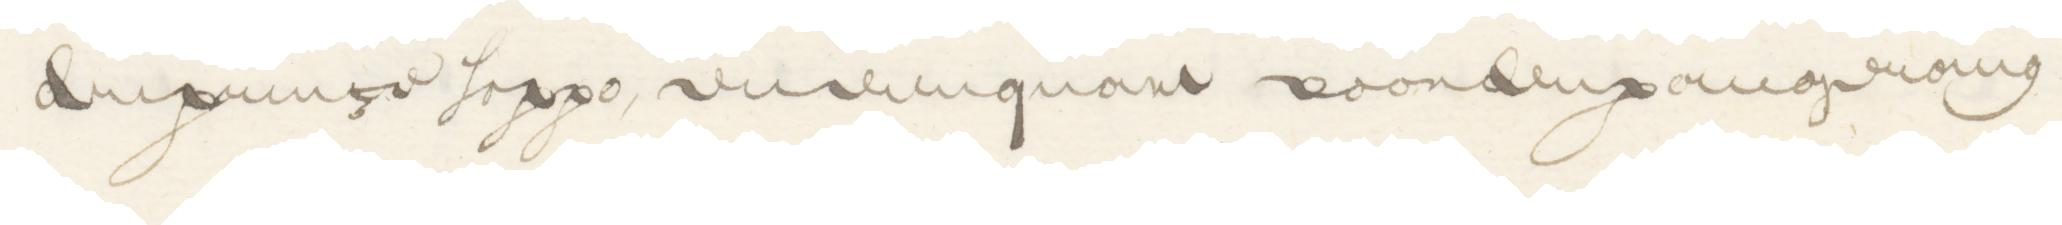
den prinçe soppo, en een quart voor den pangerang
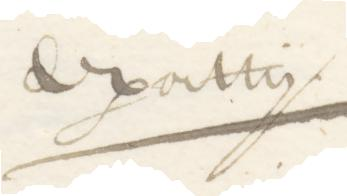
depattij
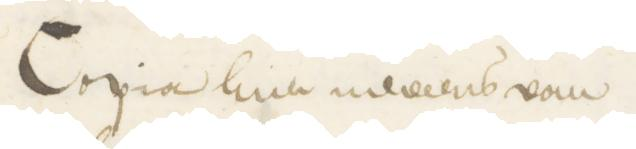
Copia hier nevens van
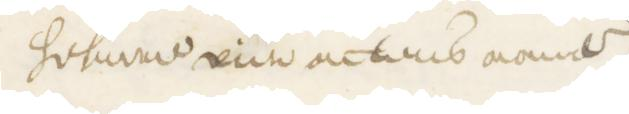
sekere vier actens aande
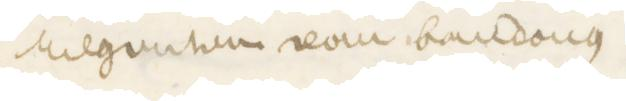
regenten van bandong
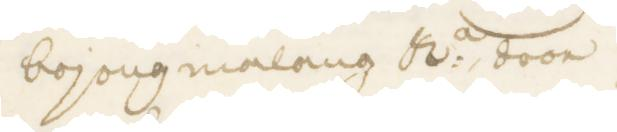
bojong malang &:a, door
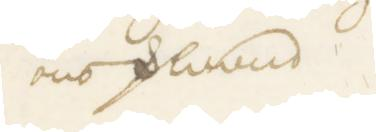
ons verleend.
